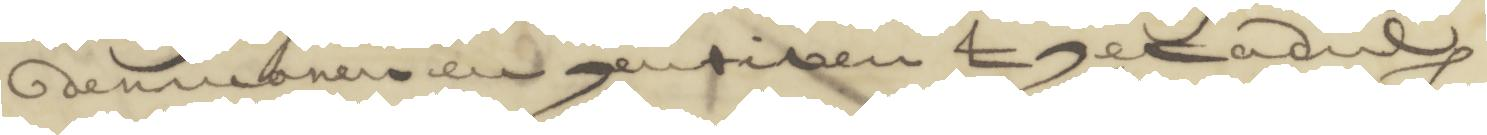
der moren en jentiven 't jecadie
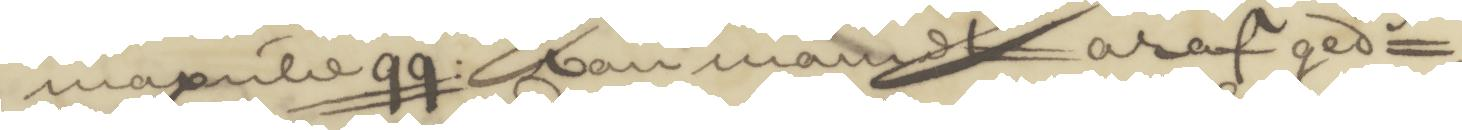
mapule qq: van mamet araf ged=s
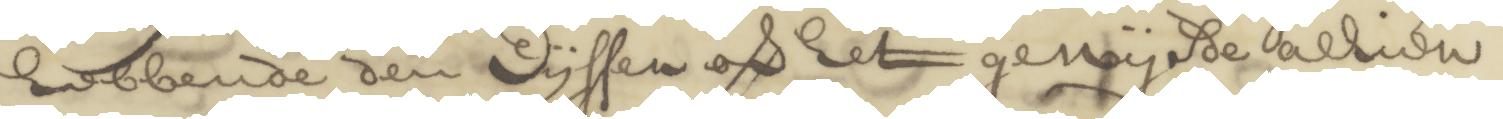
hebbende den Eijssen over het gewijsde alhier
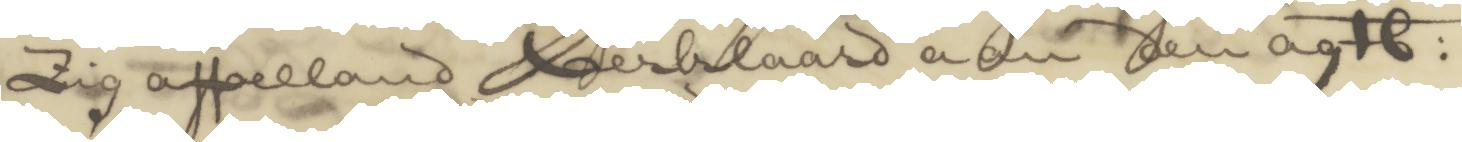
zig appelland verklaard aan den agtb:
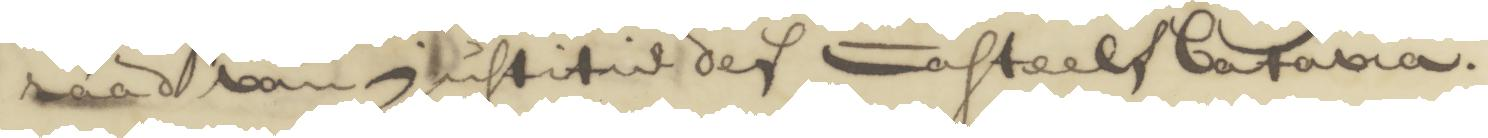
raad van Justitie des Casteels batavia.
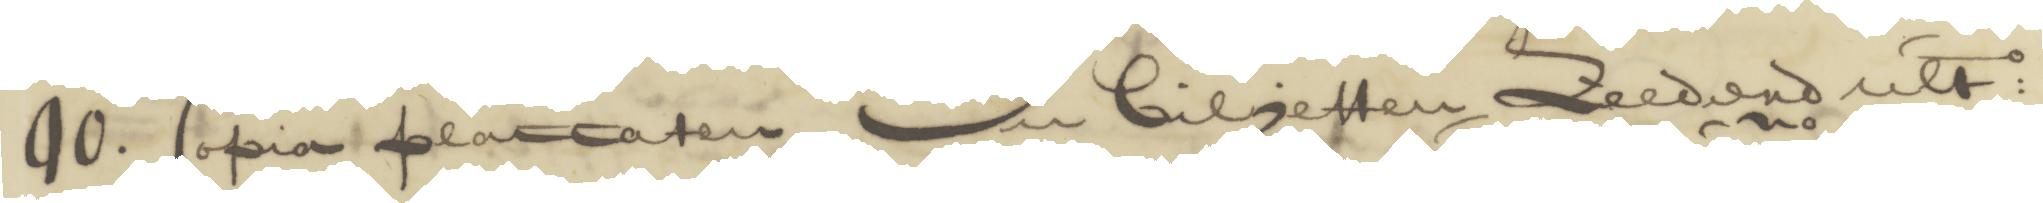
40. Copia placcaten En biljetten zeederd ult:o
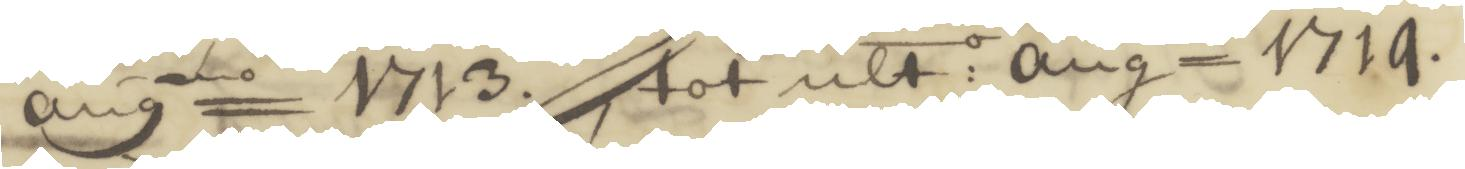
aug=o 1713. tot ult:o aug=o 1714.
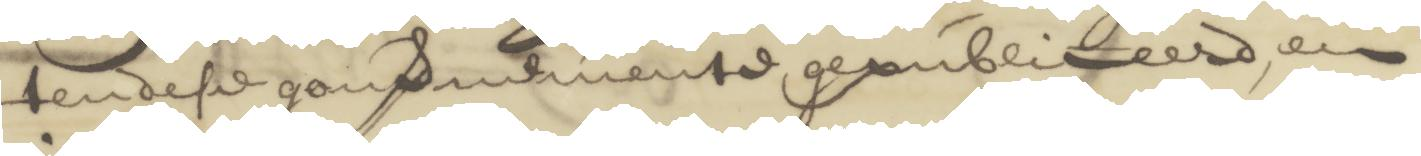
ten dese gouvernemente gepubliceerd, en
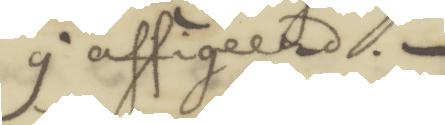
g’affigeerd.—
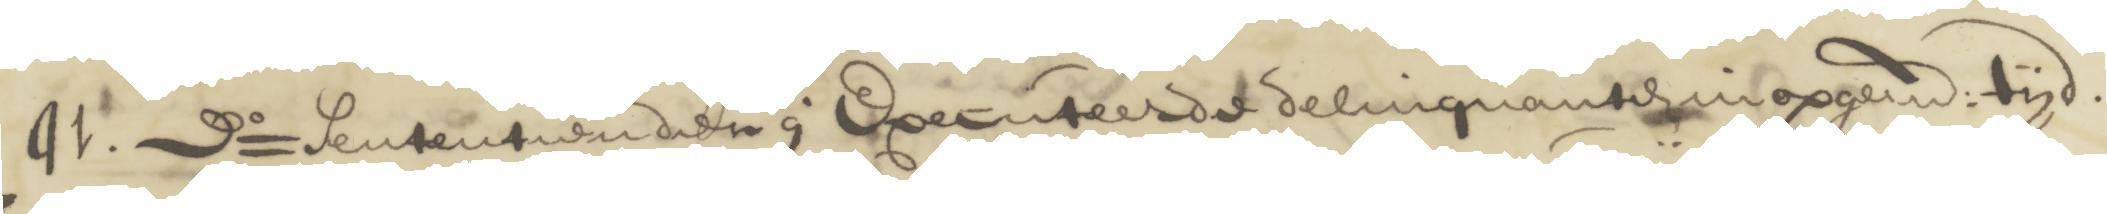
41. d=o Sententien der g’ Executeerde delinquanten in opgem: tijd.
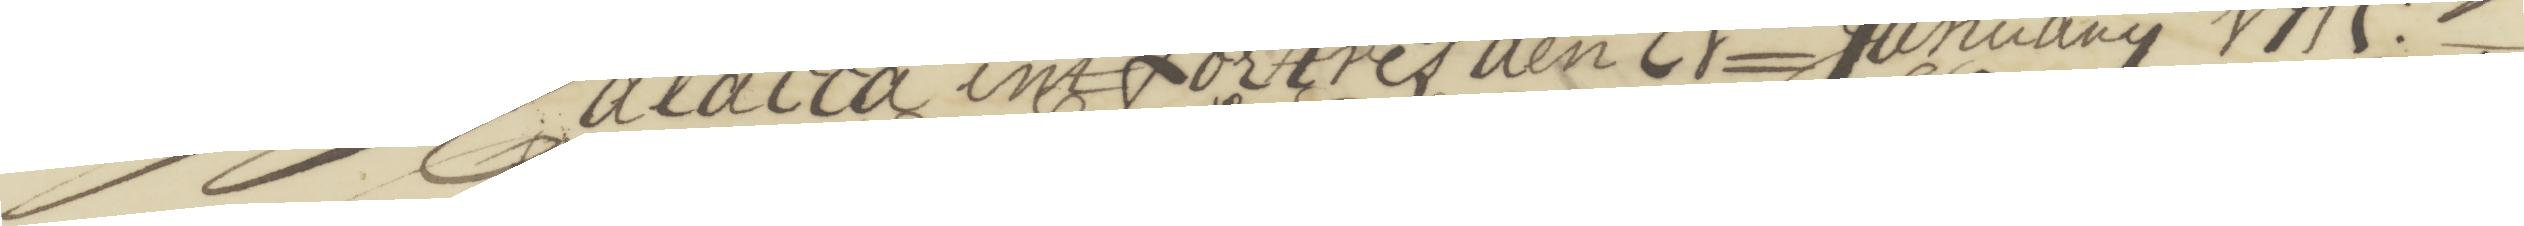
Malacca in't fortre's den 21=en Januarij 1715.-
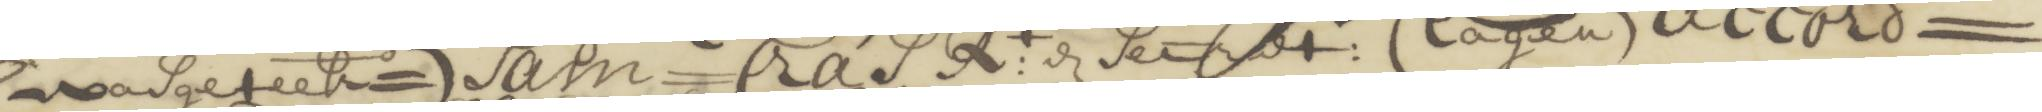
(was geteek=d) Sam=l Cras R:t en Secret: (lager) Accord=t
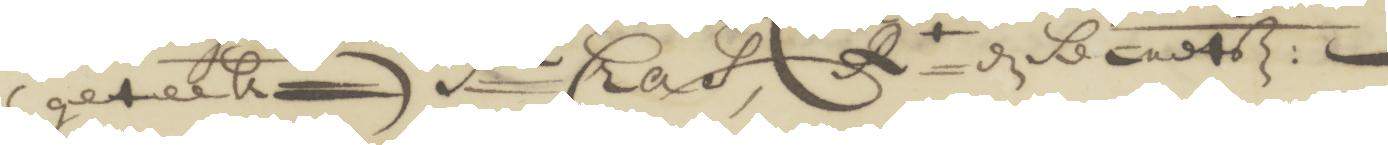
(geteek=d) S=l Cras, R=t en secrets:-
